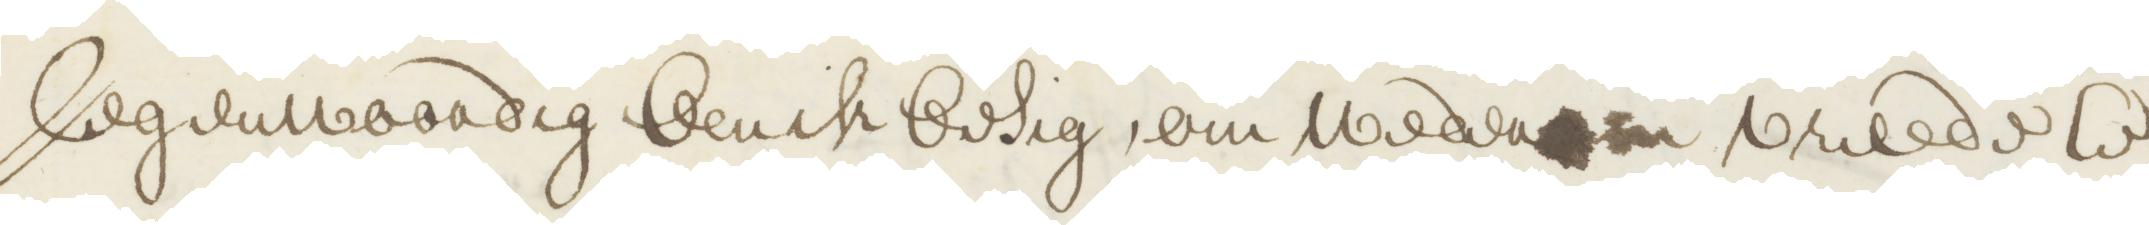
jegenwoordig ben ik besig, om weder vreede te
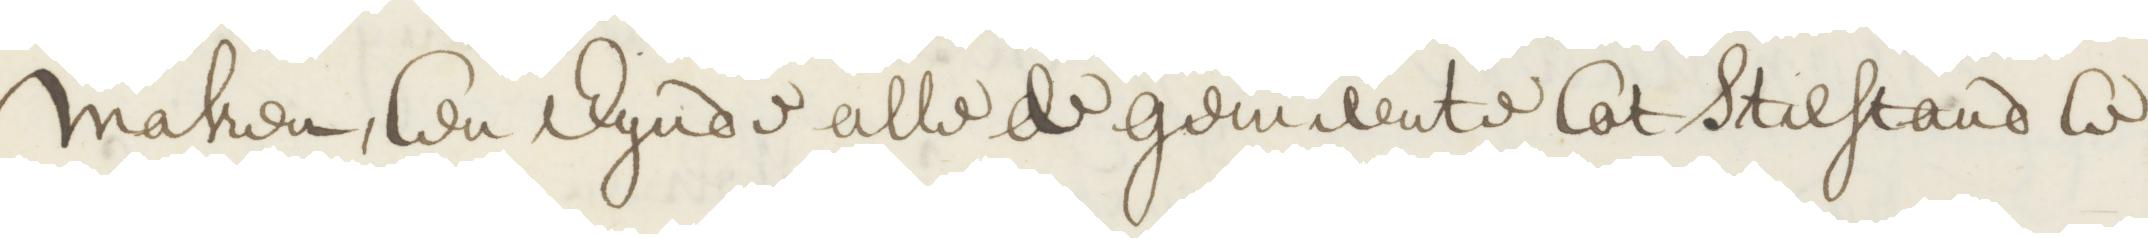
maken, ten Eynde alle de gemeente tot stilstand te
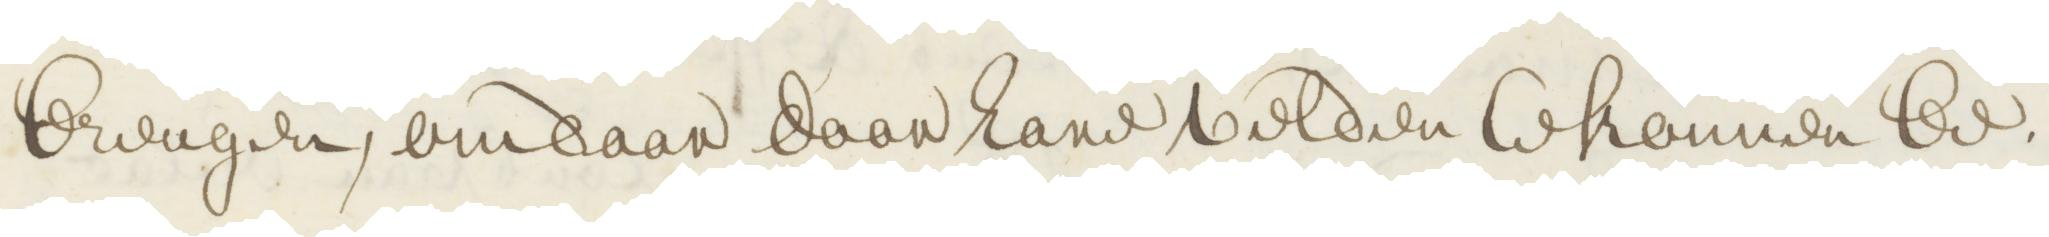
brengen, om daar door hare velden te konnen be,
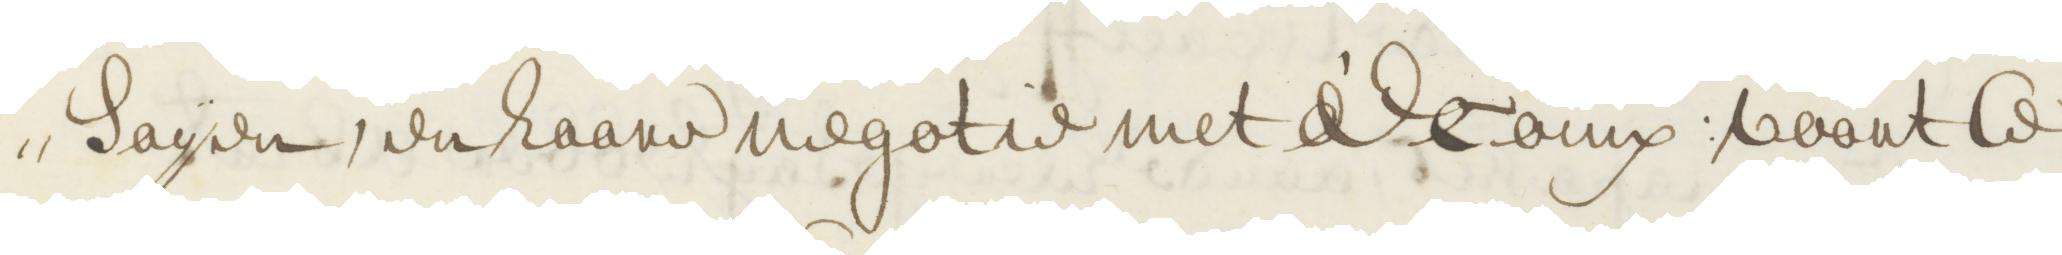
„saijen, en haare negotie met d'E Comp: voort te
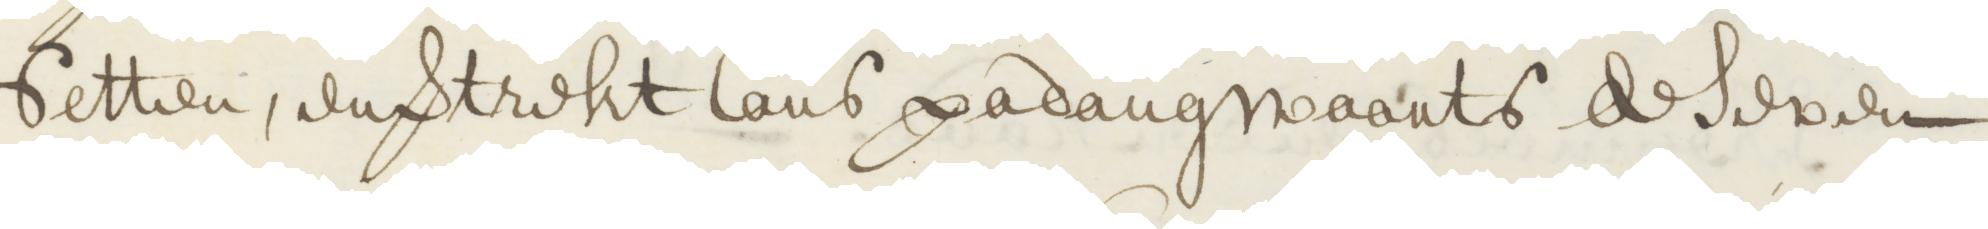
setten, en vertrekt tans padangwaarts de seven
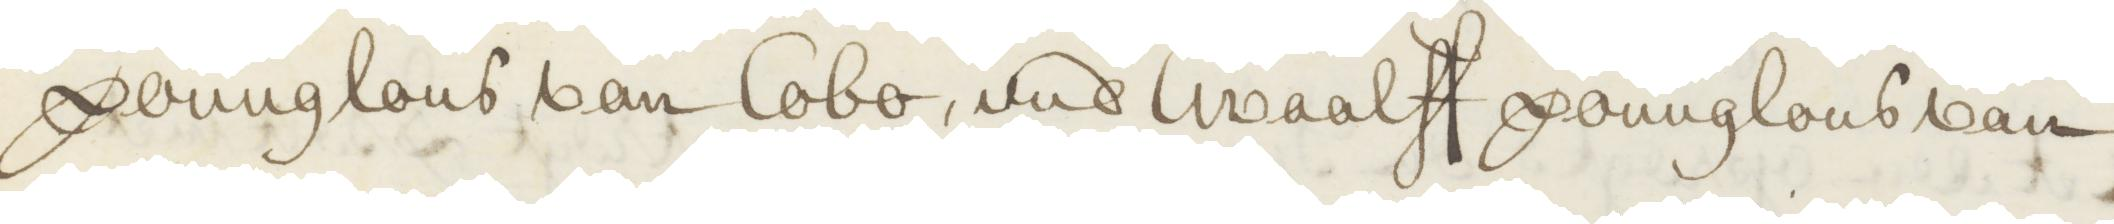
pounglons van tobo, en d' twaalff pounglons van
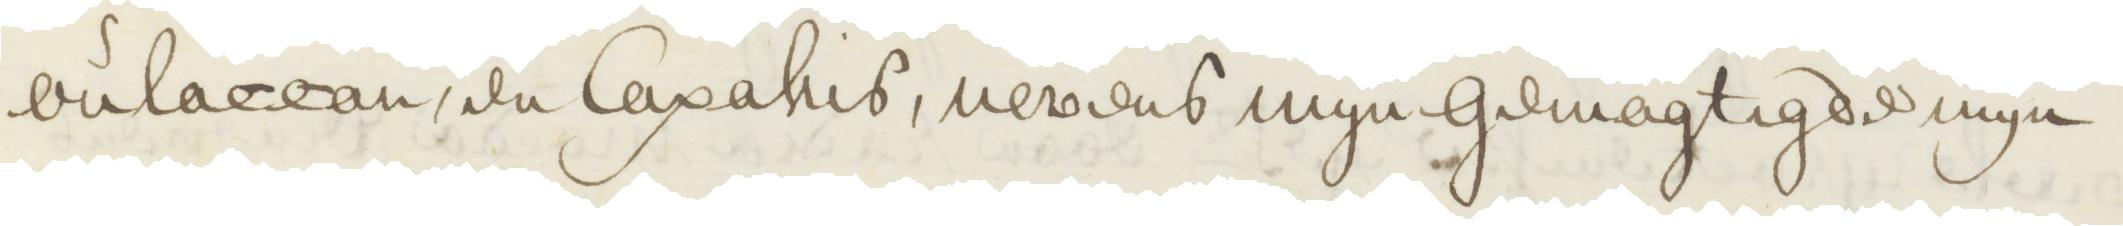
oulaccan, en tapakis, nevens mijn gemagtigde mijn
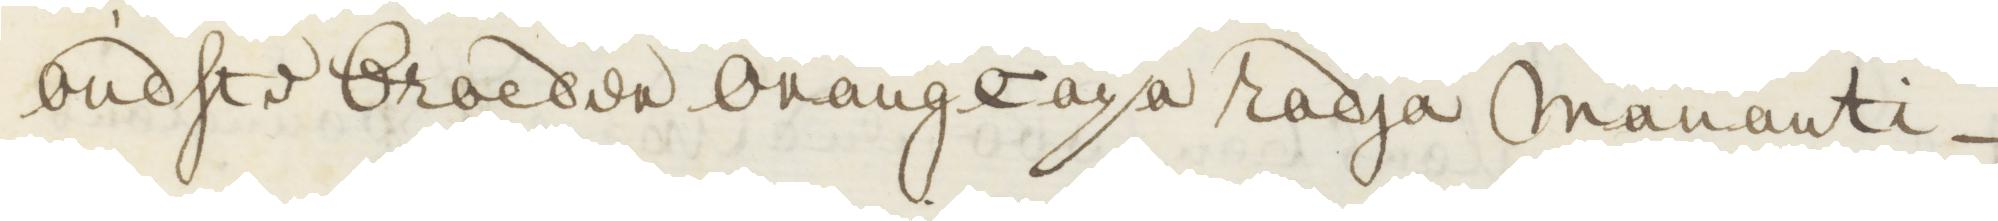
ondste broeder Orangcaija radja mananti
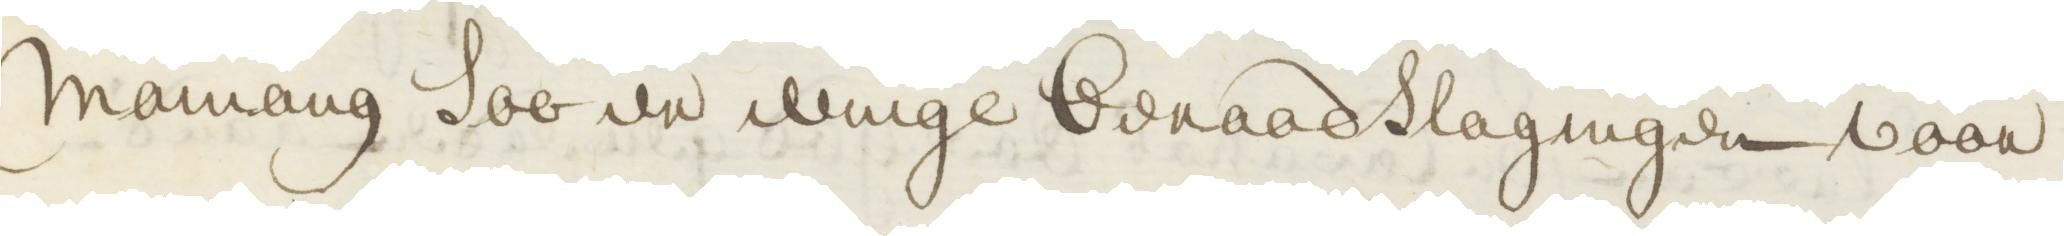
mamang soo er eenige beraadslagingen voor
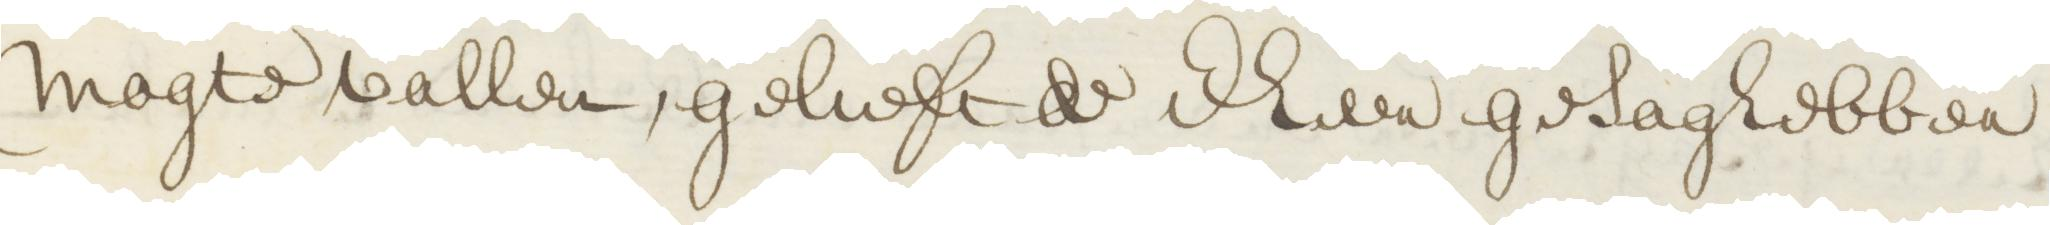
mogte vallen, gelieft de Eheer gesaghebber
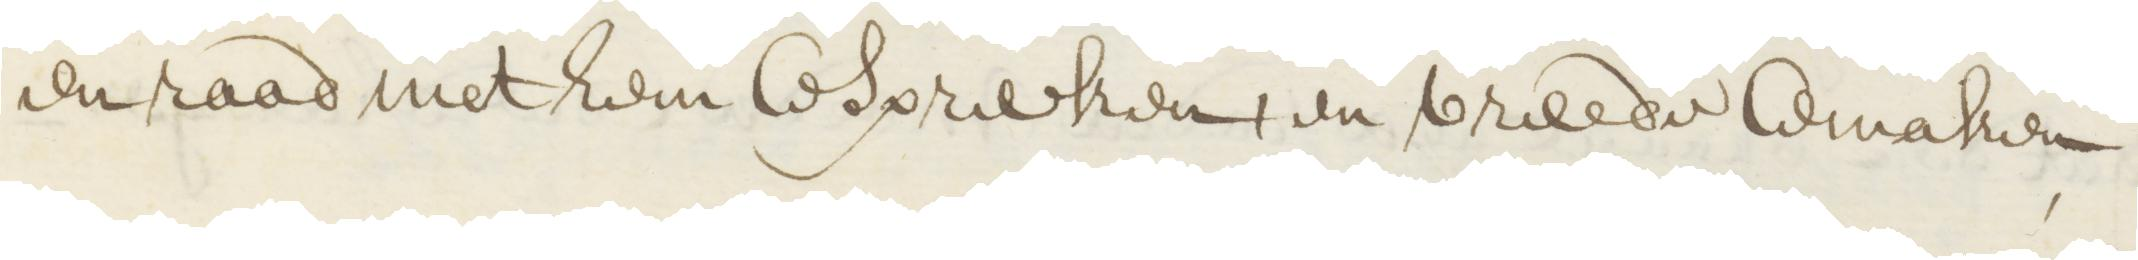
en raad met hem te spreeken, en vreede te maken
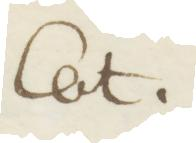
tot.
